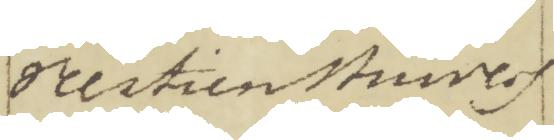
veertien stuivers
